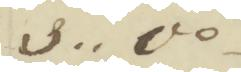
3 „ do
